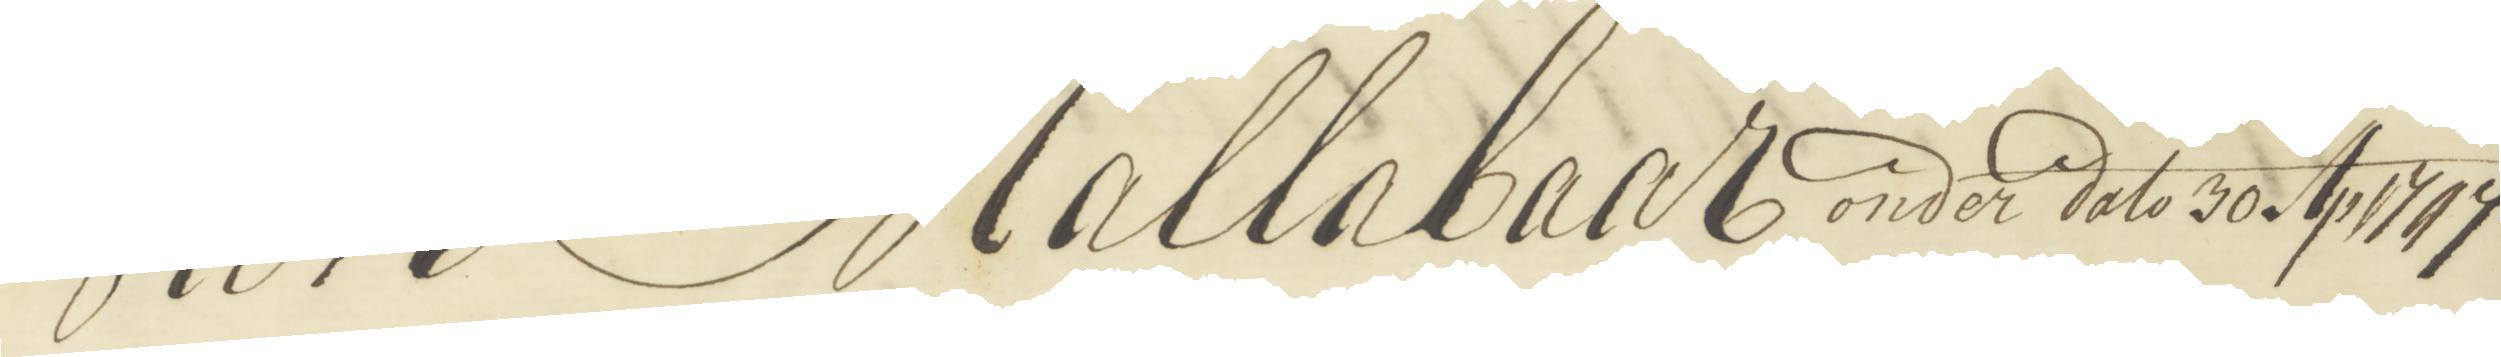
Van Mallabaar onder dato 30 Ap 1747
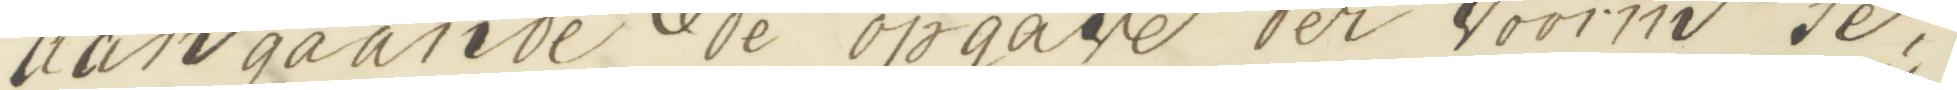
aangaande de opgave der voorm se„
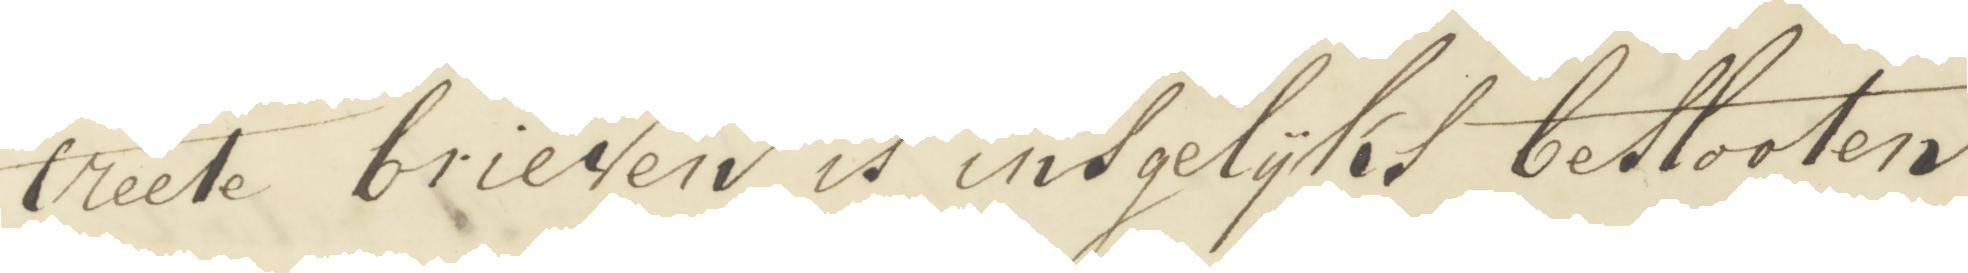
creete brieven is insgelijks beslooten
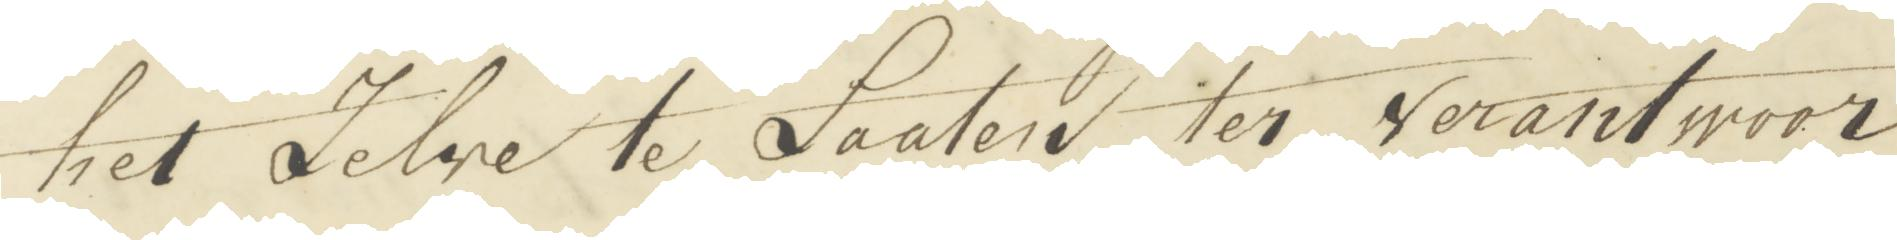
het zelve te laaten ter verantwoor
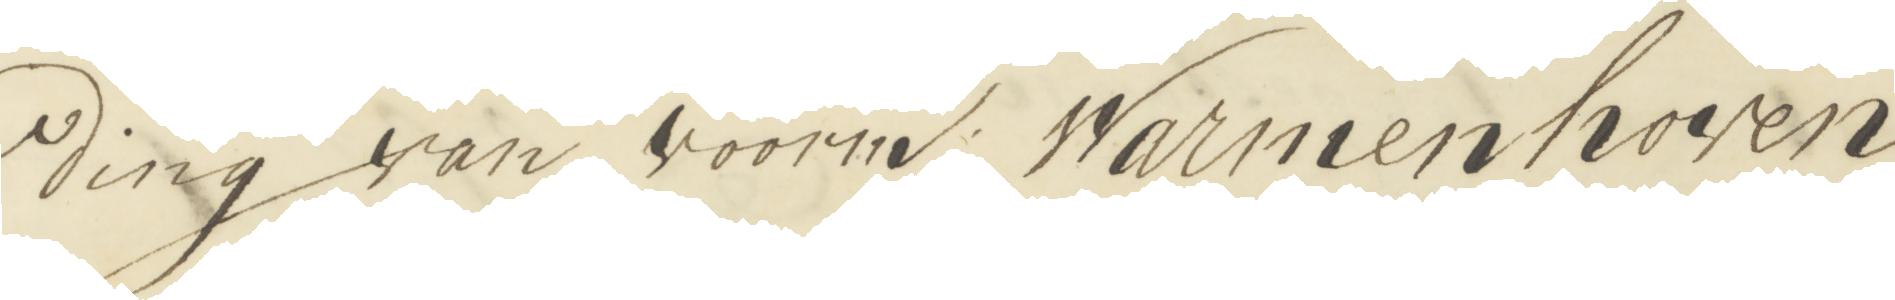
ding van voorm: Warmenhoven
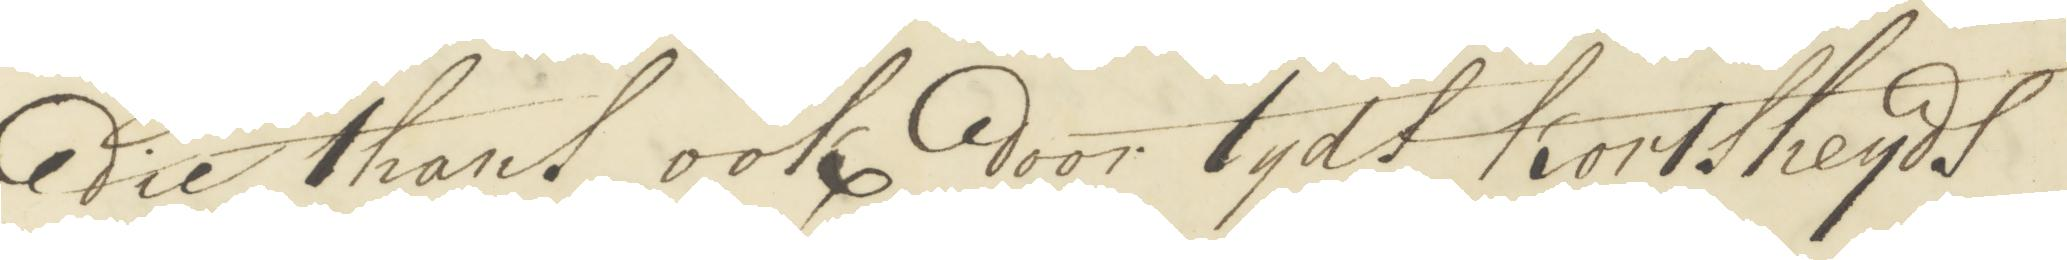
die thans ook door tyds kortsheyds
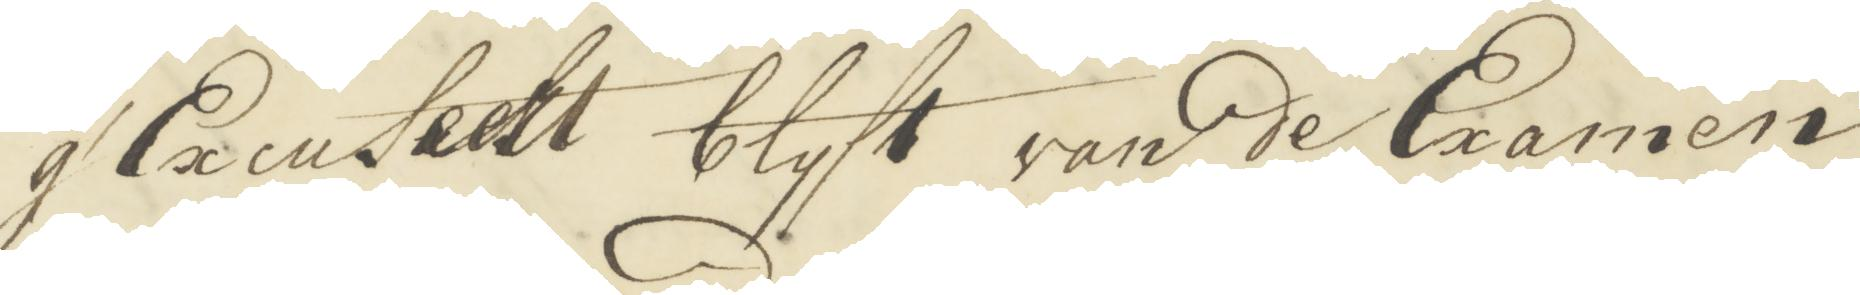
g’ Excuseert blyft van de Examen
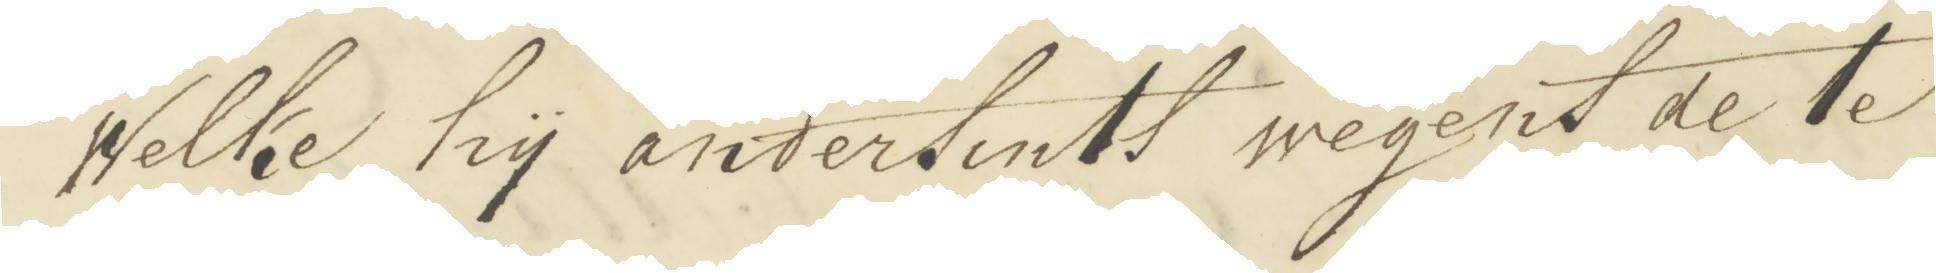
welke hij andersints wegens de te
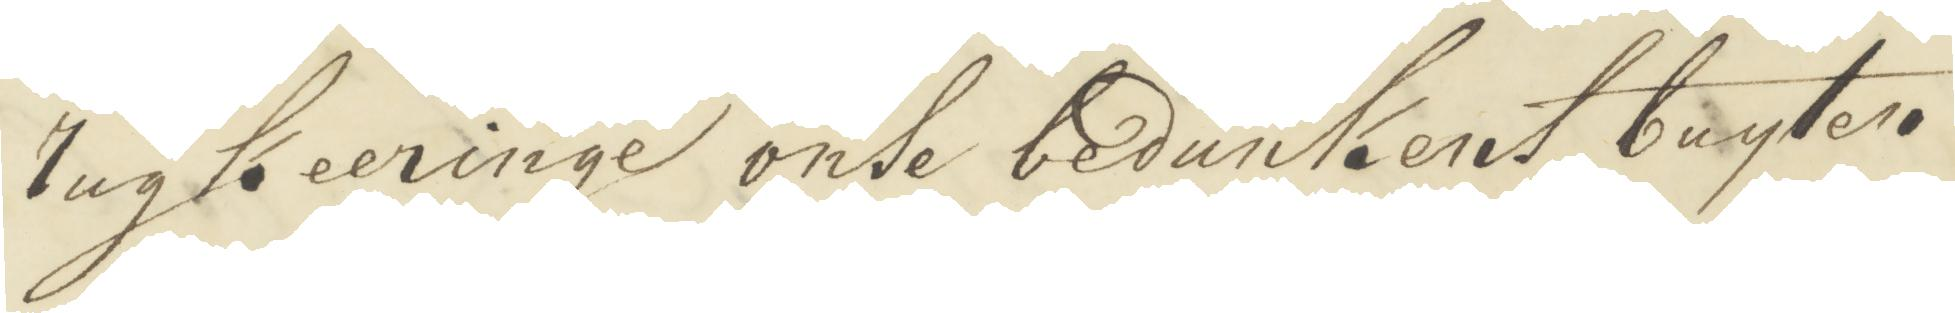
rugkeeringe onse bedunkens buyten
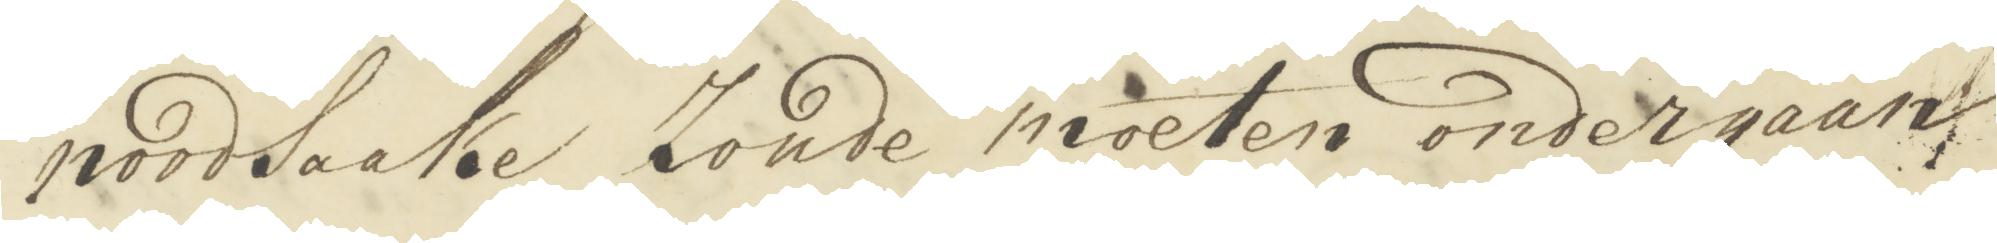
noodsaake zoude moeten ondergaan
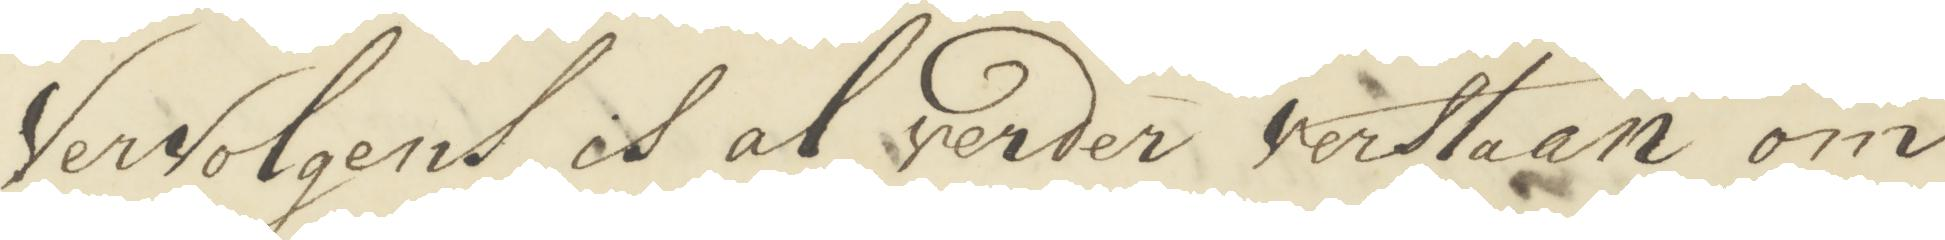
Vervolgens is al verder verstaan om
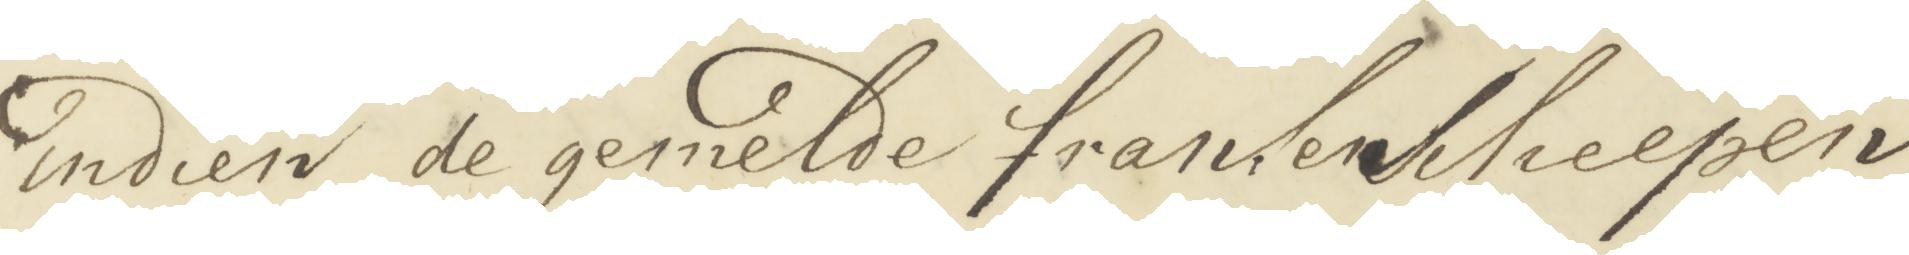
indien de gemelde fransen scheepen
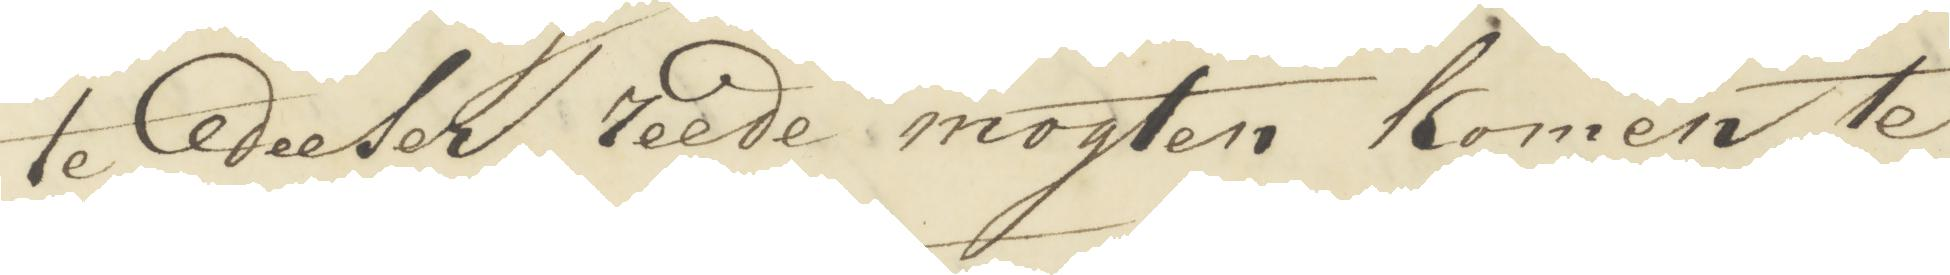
te deeser reede mogten komen te
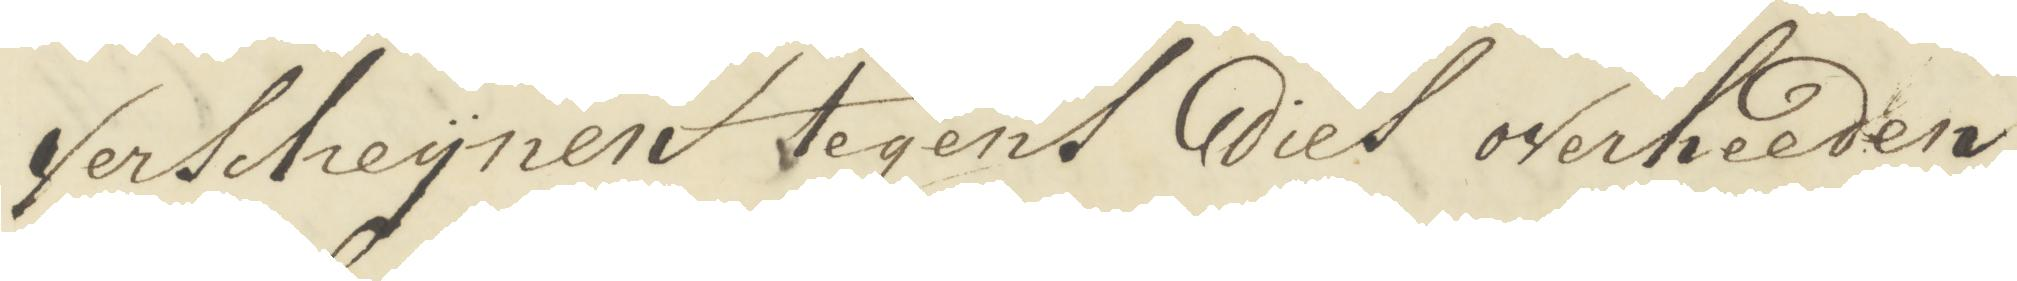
verscheijnen tegens dies overheeden
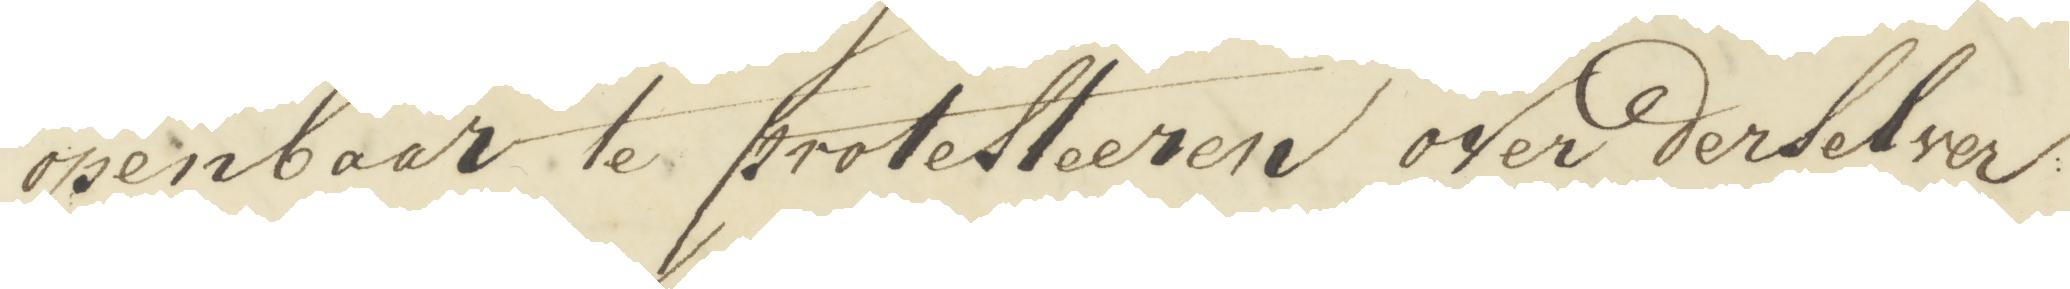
openbaar te protesteeren over derselver
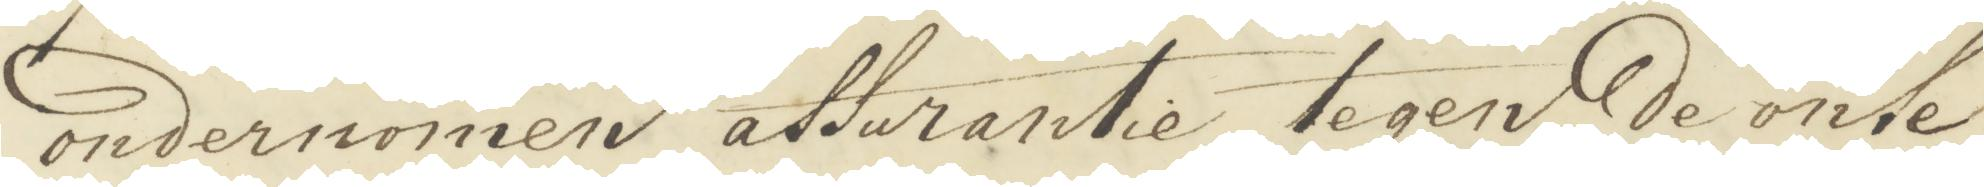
ondernomen assurantie tegen de onse
